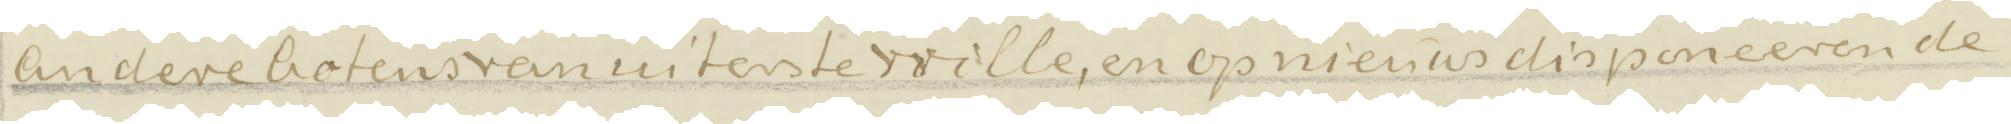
andere Actens van uiterste wille, en opnieuw disponeerende
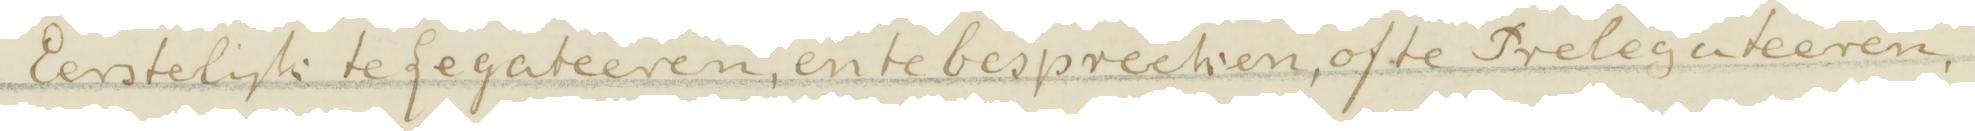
Eerstelijk te Legateeren, en te bespreeken, of te Prelegateeren
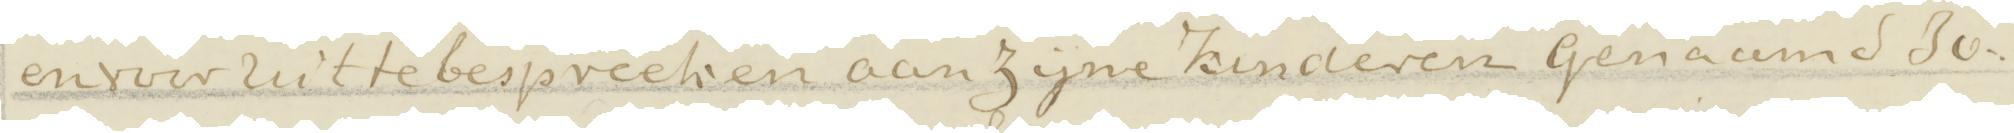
en voor uit te bespreeken aan Zijne kinderen genaamd Jo=
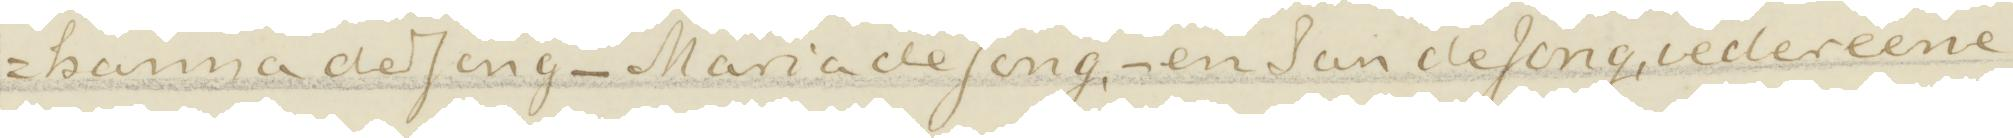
=hanna de Jong - Maria de Jong - en Jan de Jong ieder eene
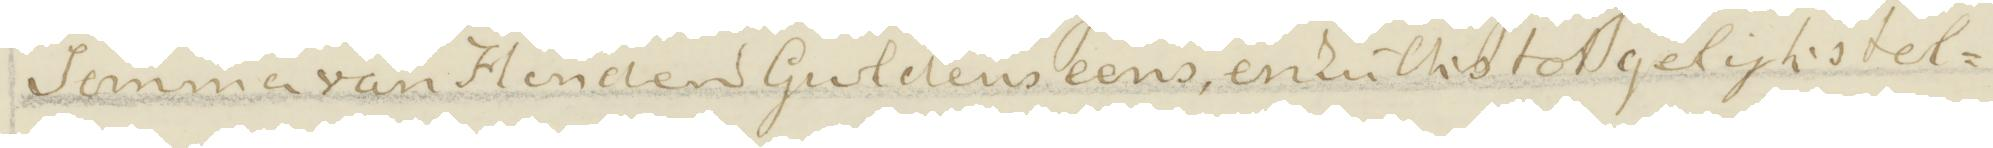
Somma van Honderd Guldens eens en zulks tot gelijkstel=
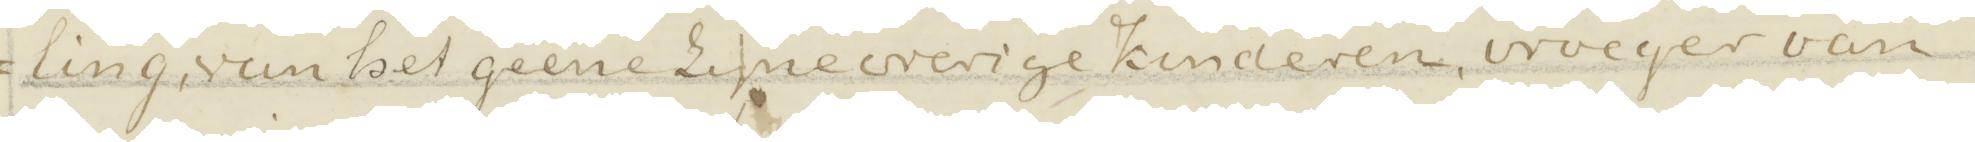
=ling van het geene Zijne overige kinderen, vroeger van
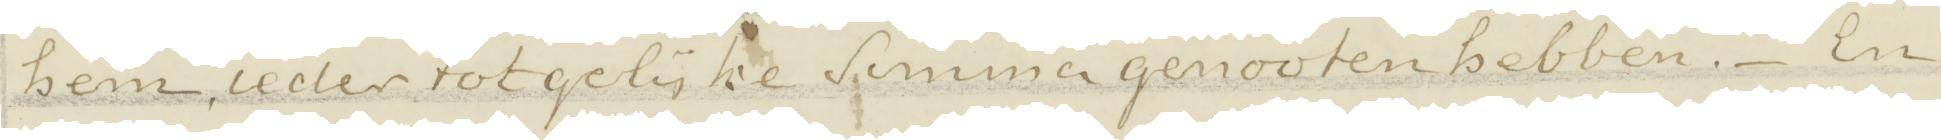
hem, ieder tot gelijke Somma genooten hebben. — En
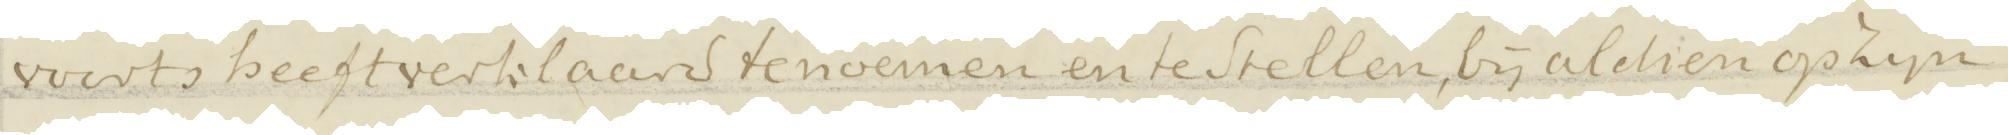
voorts heeft verklaard te noemen en te stellen, bij aldien op Zyn
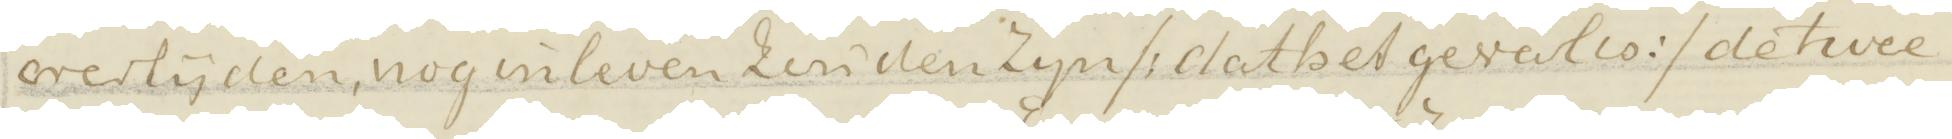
overlijden nog inleven konden Zyn /: dat het geval is :/ de twee
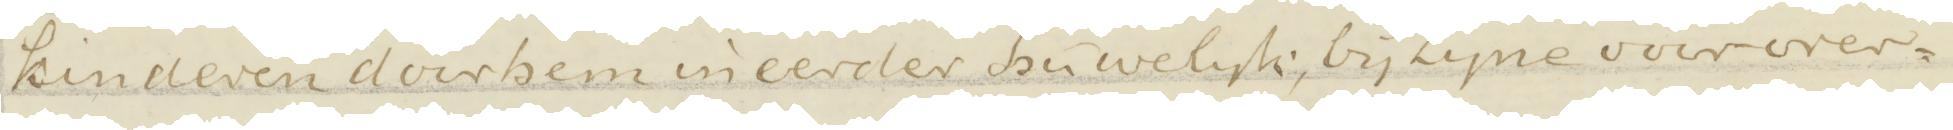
kinderen door hem in eerder huwelyk, bij Zyne voor over=
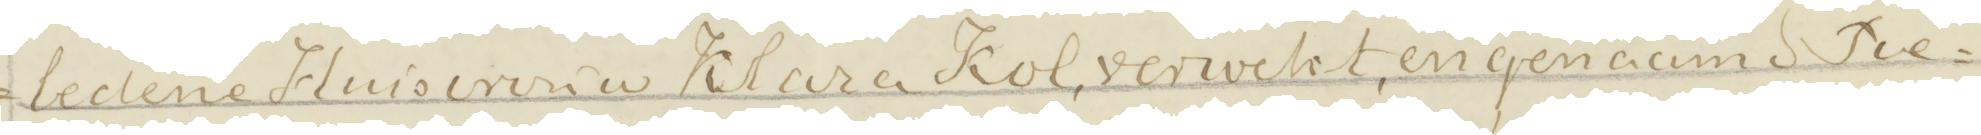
„ledene Huisvrouw Klara Kol, verwekt en genaamd Pie=
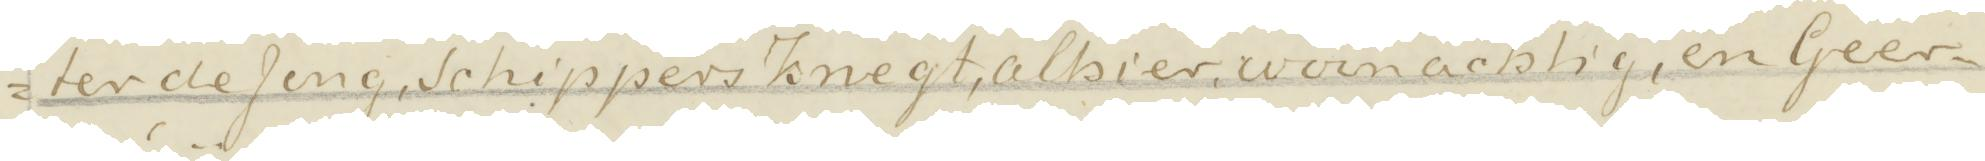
=ter de Jong, Schippers knegt, alhier, woonachtig,en Geer-
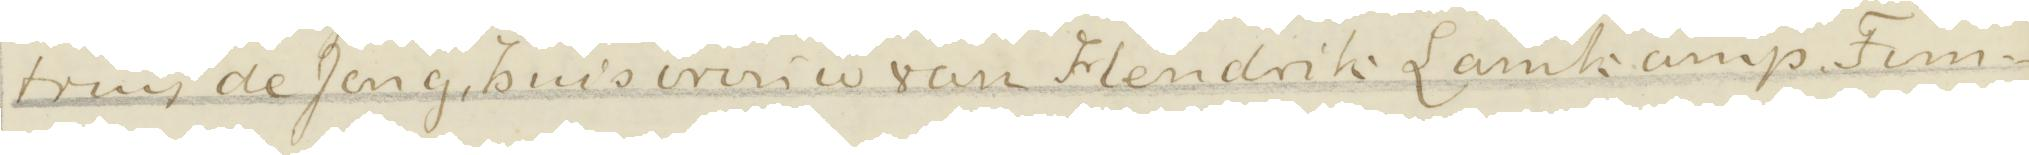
truij de Jong huisvrouw van Hendrik Lamkamp, Tim-
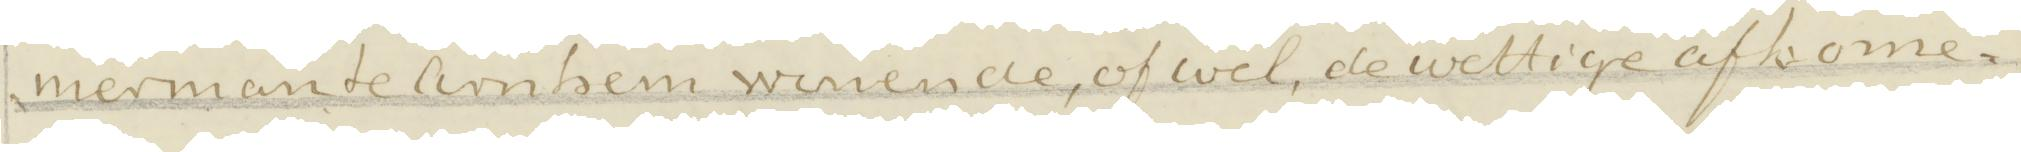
merman te Arnhem wonende, of wel de wettige afkome-
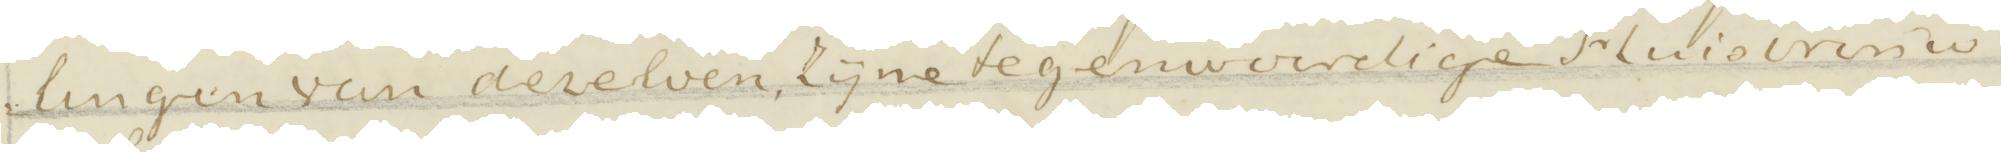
lingen van dezelven, Zijne tegenwoordige Huisvrouw
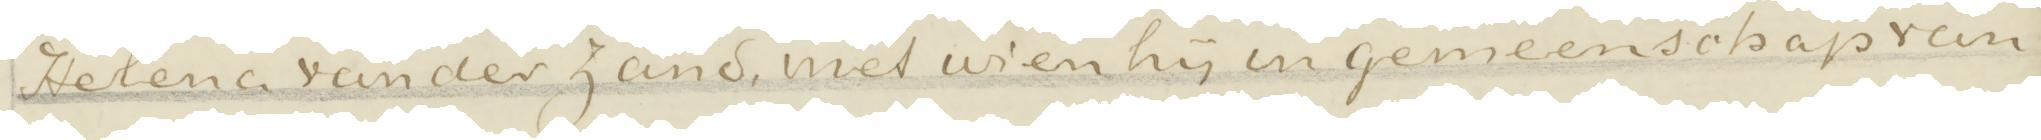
Helena van der Zand met wien hij in gemeenschap van
